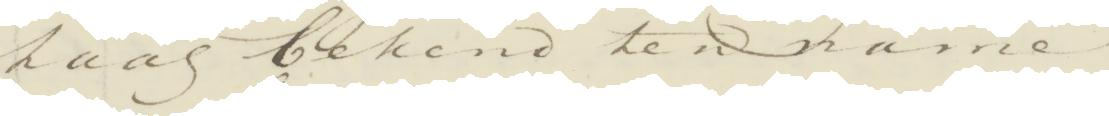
taal bekend ten name
